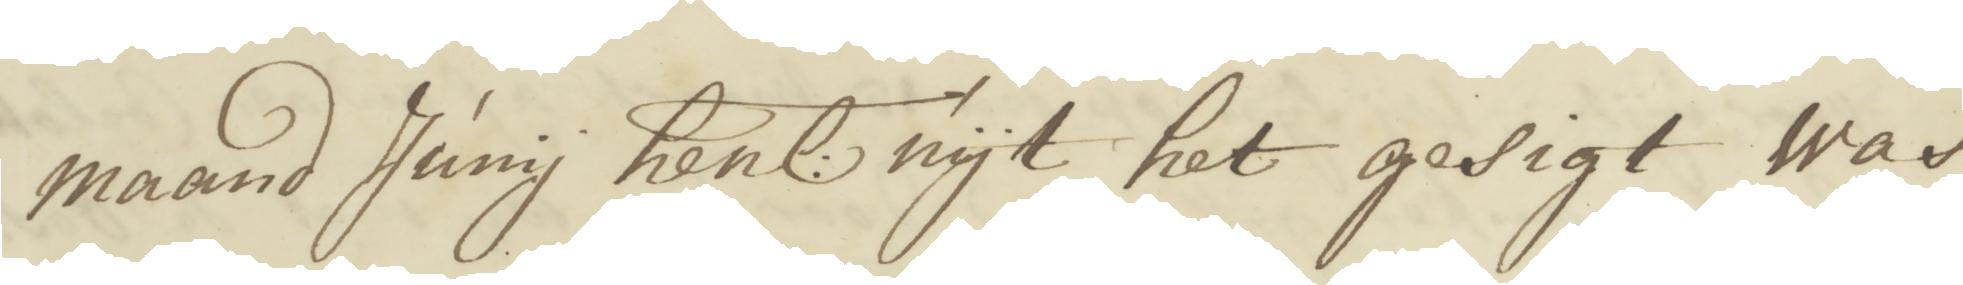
maand Junij henl: uijt het gesigt was
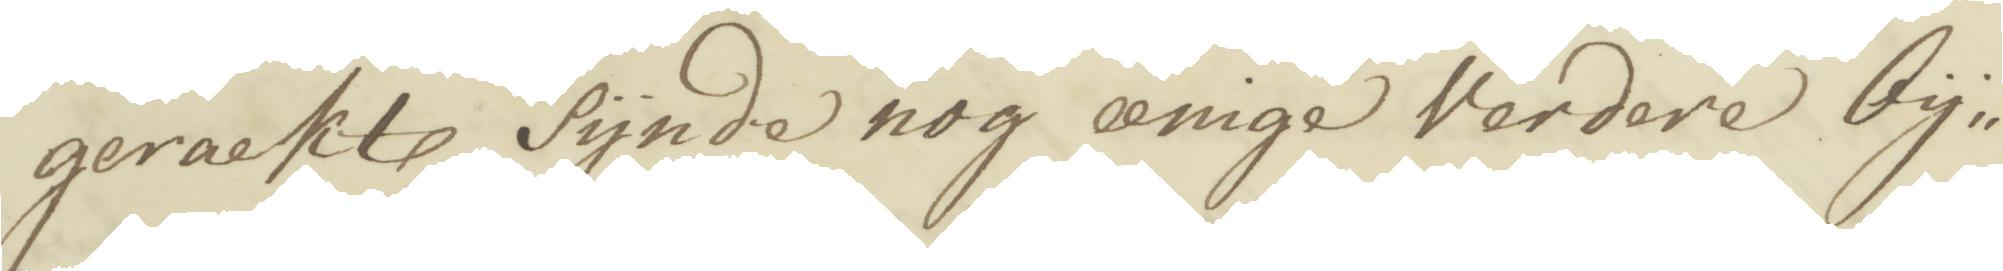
geraekt sijnde nog eenige verdere bij„
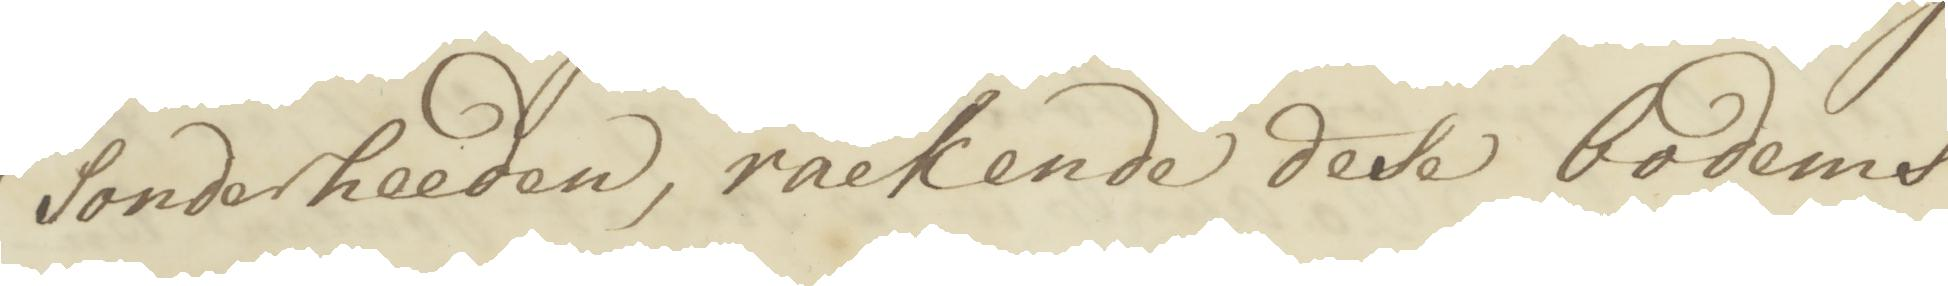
sonderheeden, raekende dese bodems
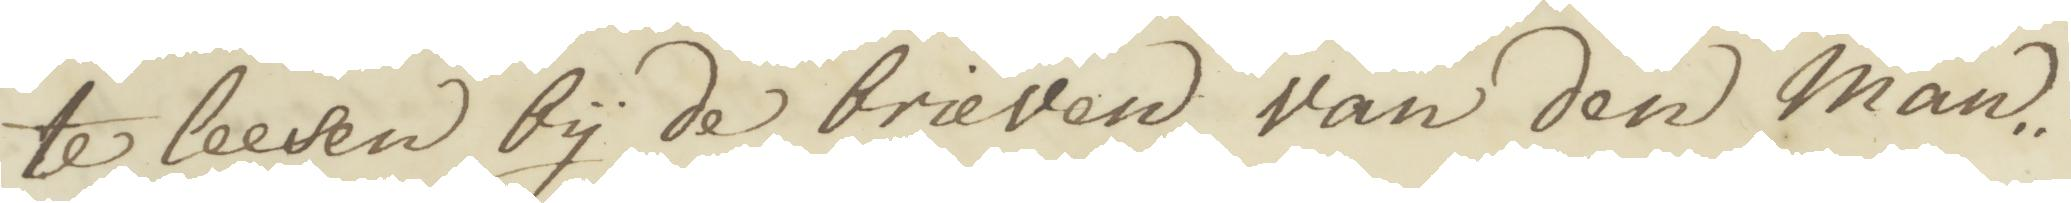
te leesen bij de brieven van den man„
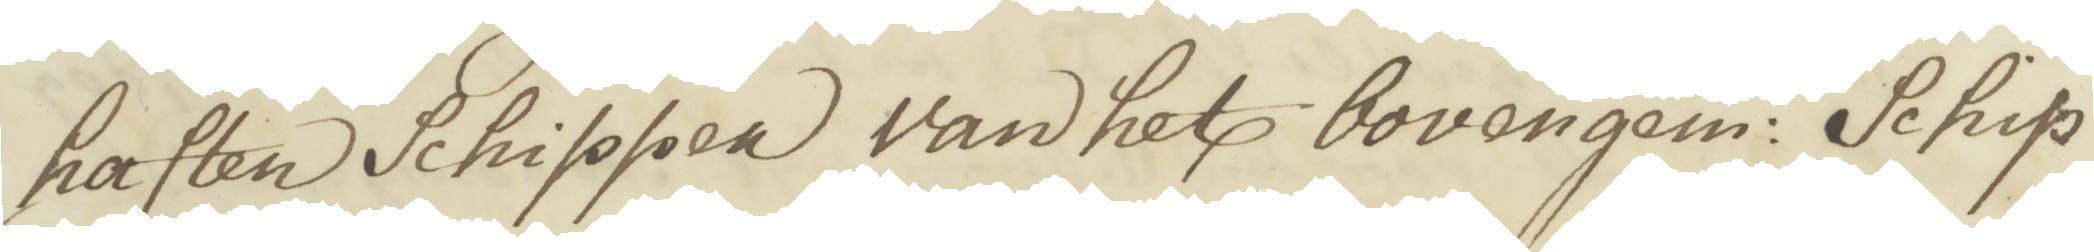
haften schipper van het bovengem: schip
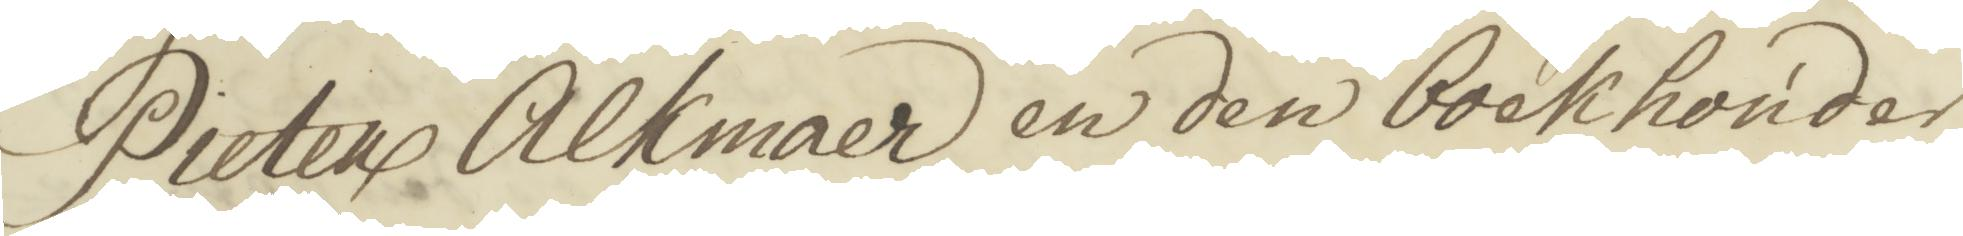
Pieter Alkmaer en den boekhouder
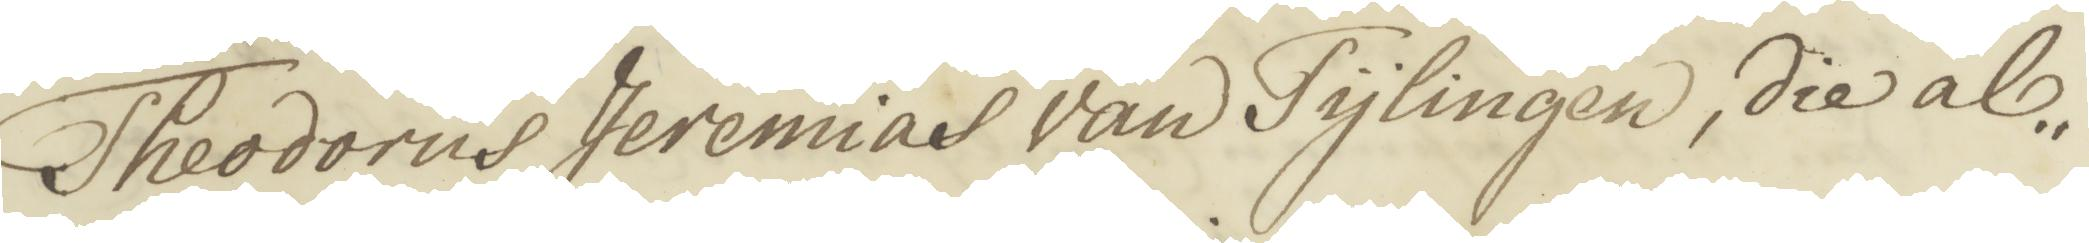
Theodorus Jeremias van Tijlingen, die al„
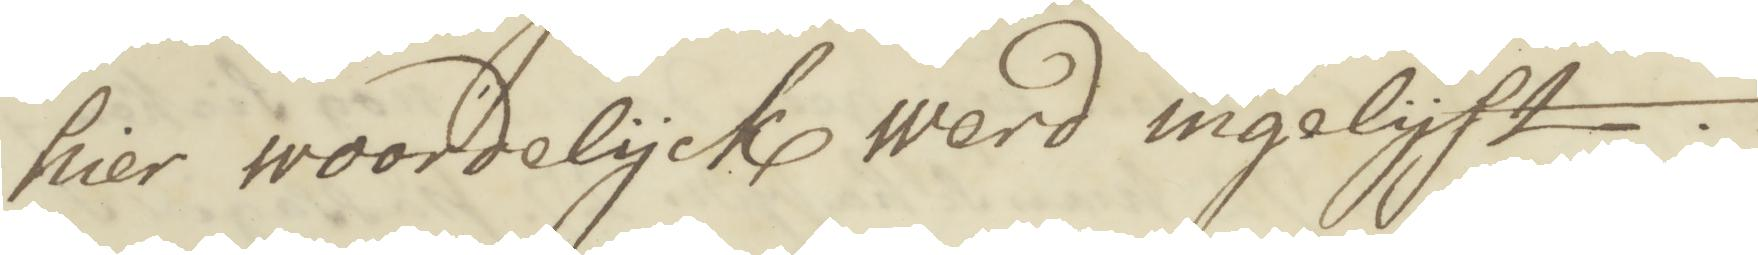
hier woordelijck werd ingelijft.
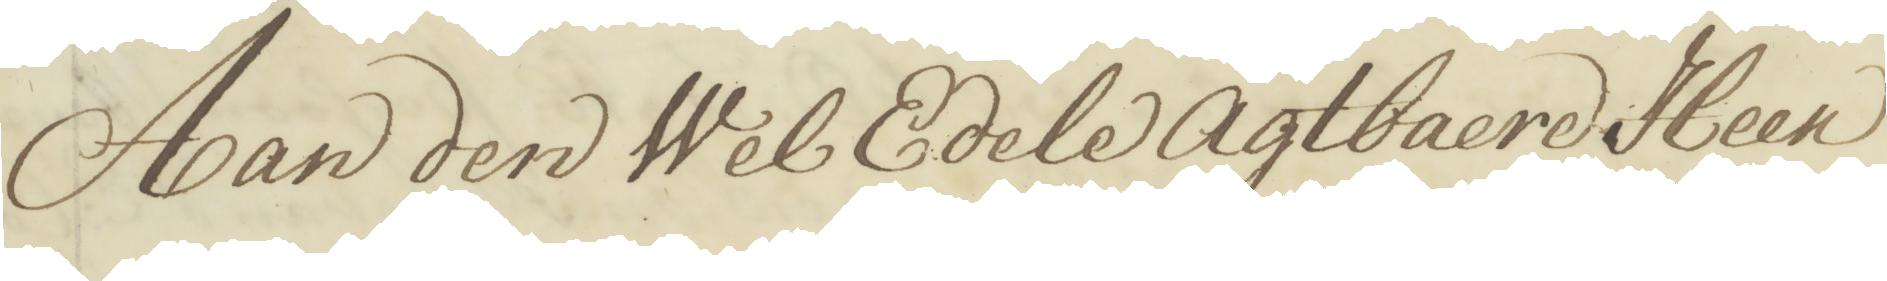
Aan den Wel Edele Agtbaere Heer
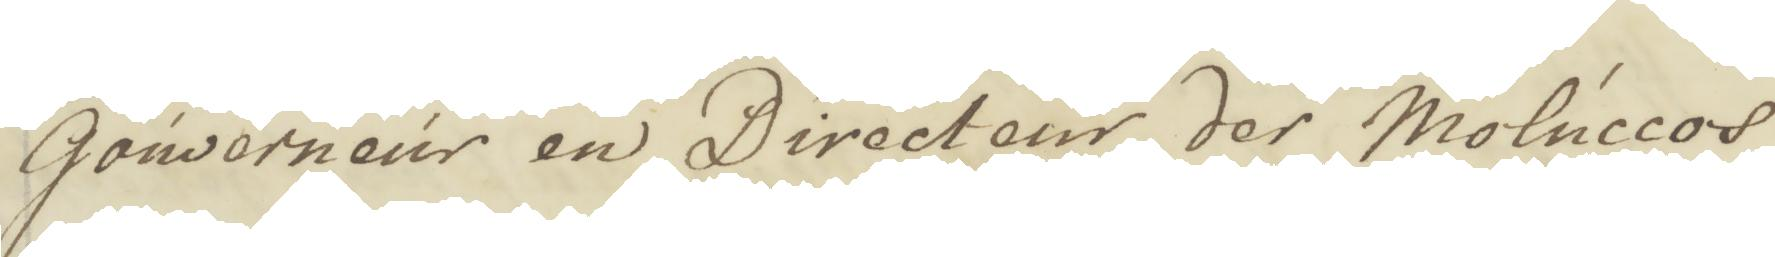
Gouverneur en Directeur der Moluccos
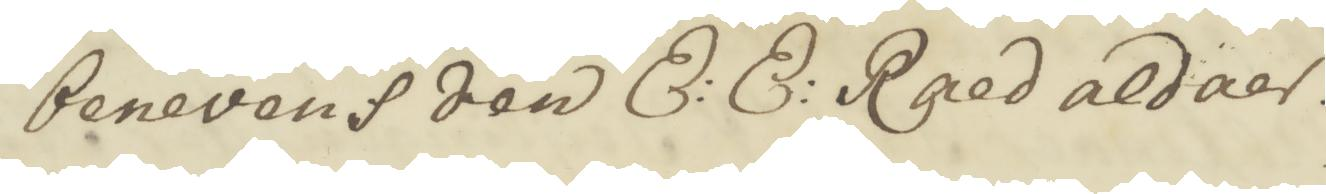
benevens den E:E: Raed aldaer
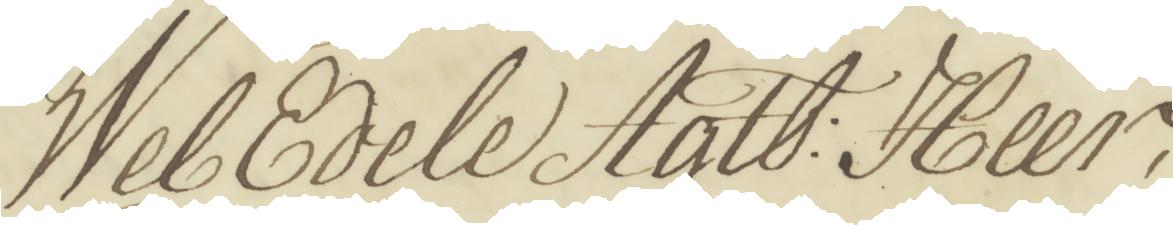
Wel Edele Agtb: Heer,
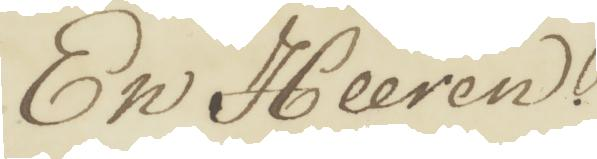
En Heeren.
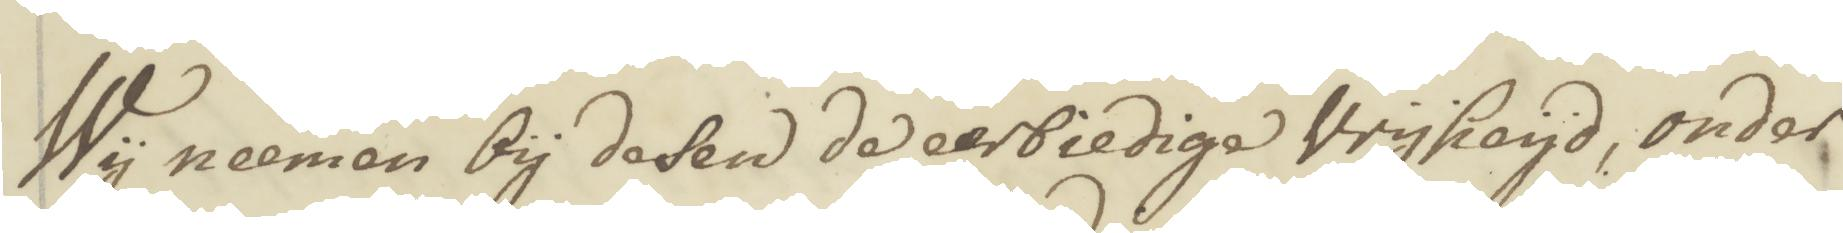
Wij neemen bij desen de eerbiedige vrijheijd, onder
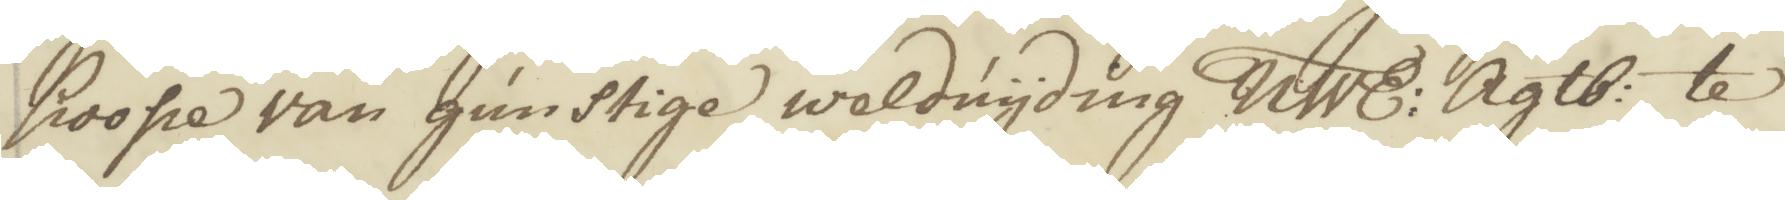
hoope van gunstige welduijding UWE: Agtb: te
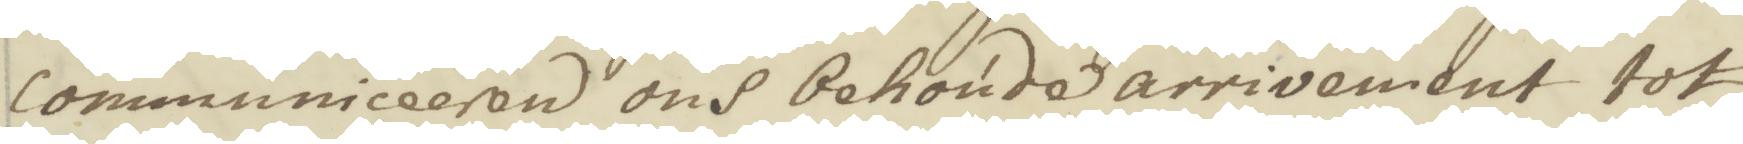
communiceeren ons behoude arrivement tot
